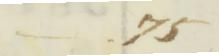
- .75
